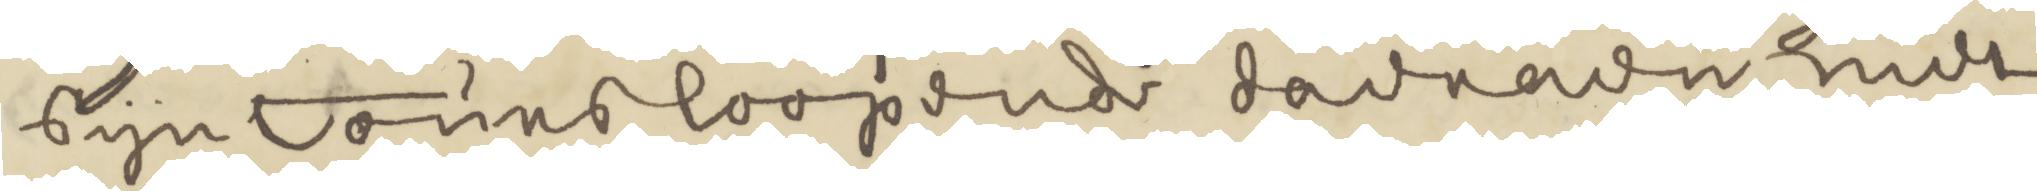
sijn coursloopende daeraen niet
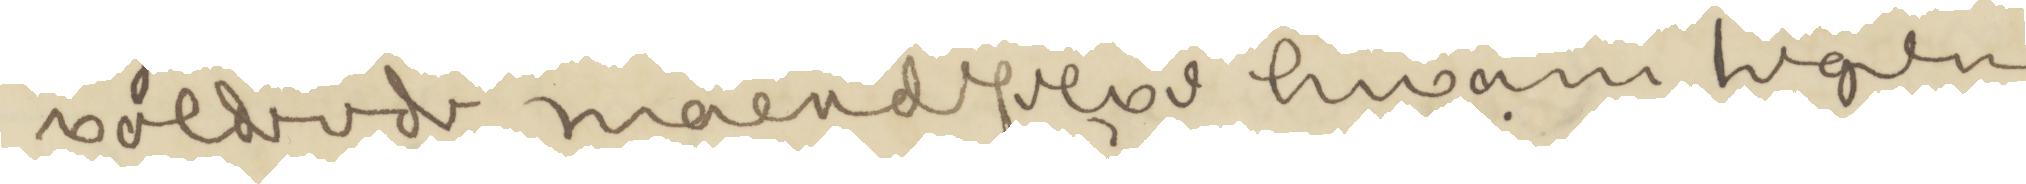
voldeede maerdeselve kwam tegen
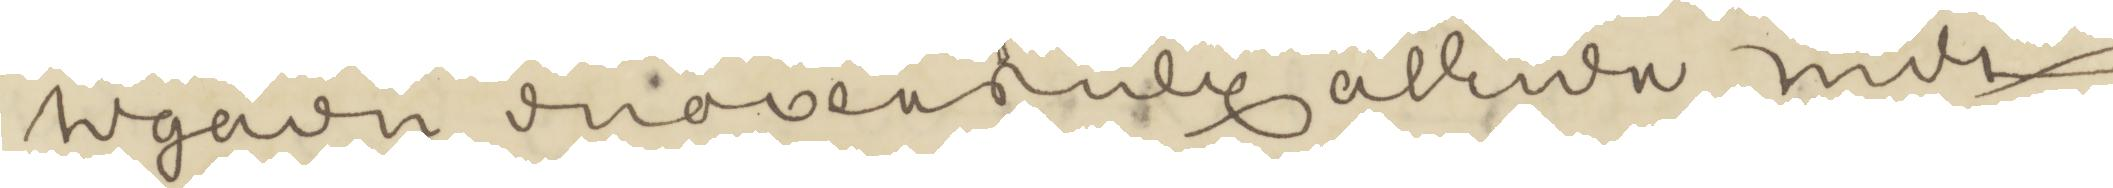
tegaen en oversulx alhier niet
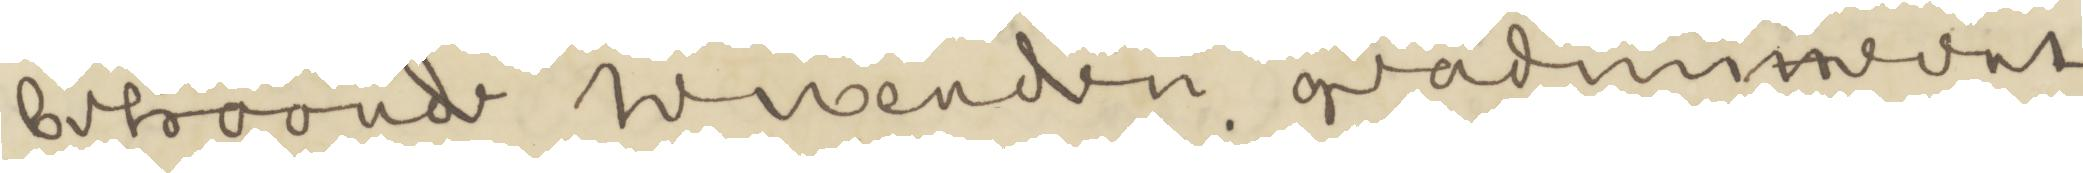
behoorde te werden geadmitteert
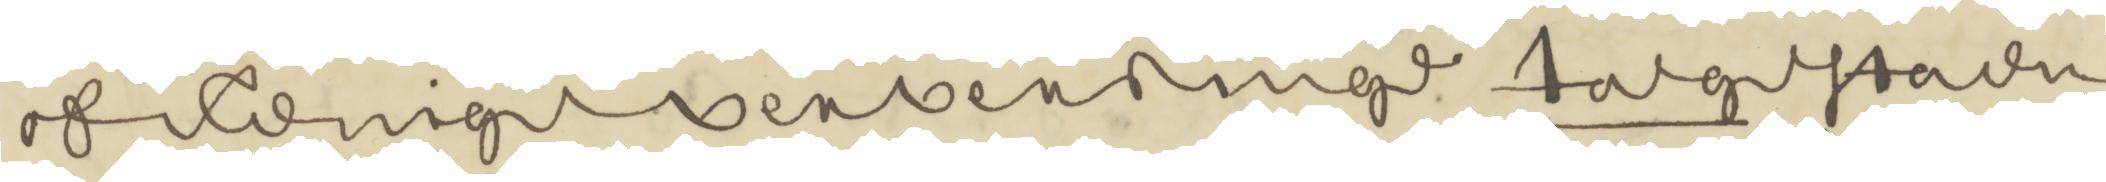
of Eenige verversinge toegestaen
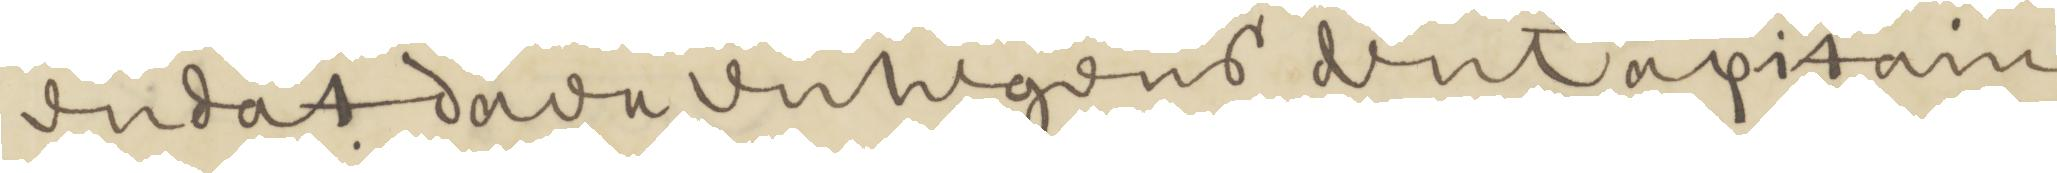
en dat daer en tegens den Capitain
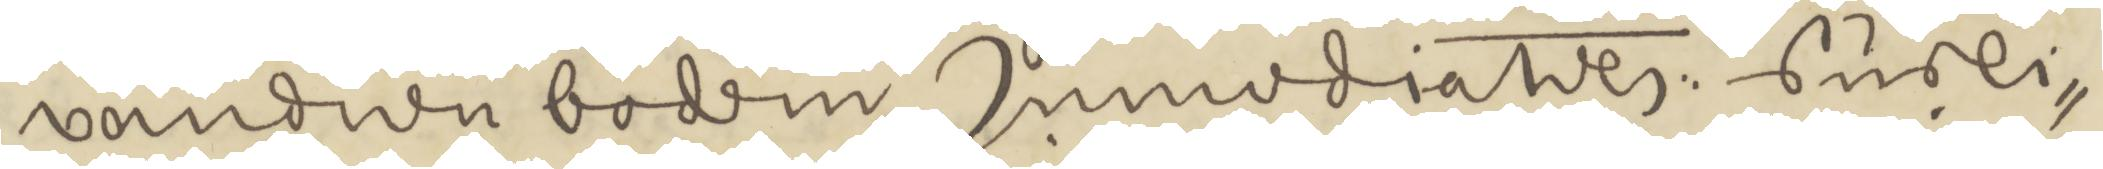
van dien bodem Jnmediatelijk susti„
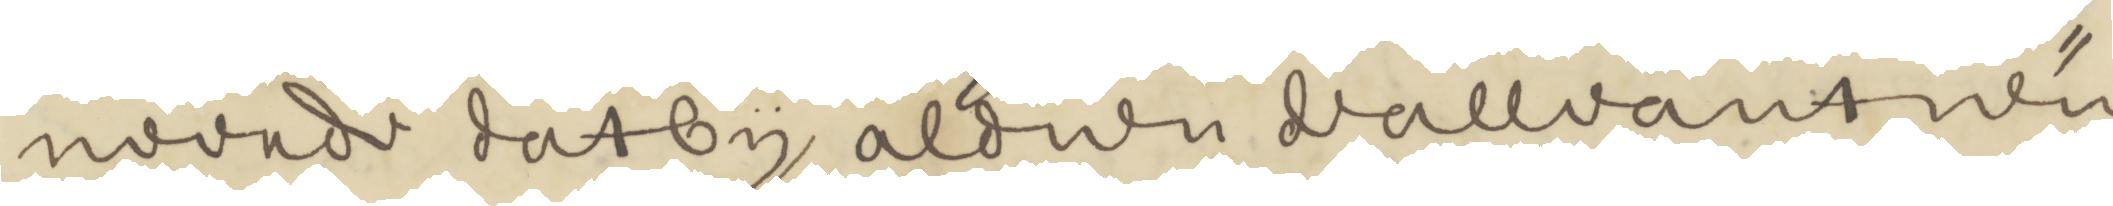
neerde dat bij aldien de alleantien
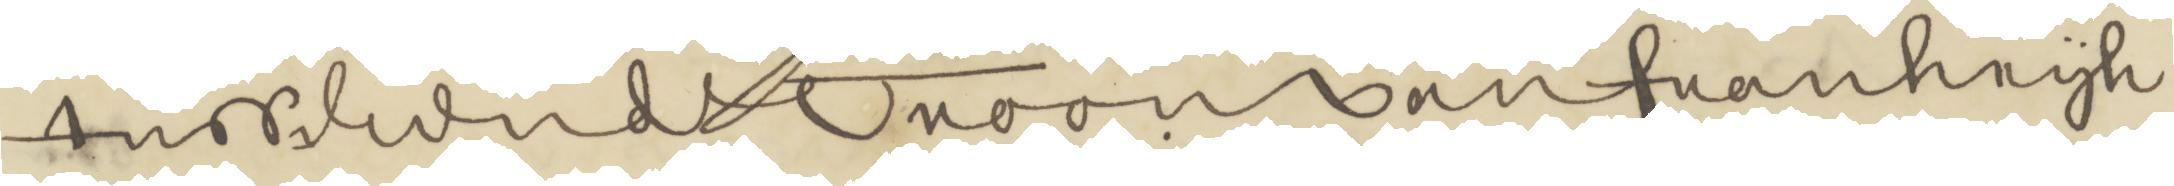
tusschen de Croon van frankrijk
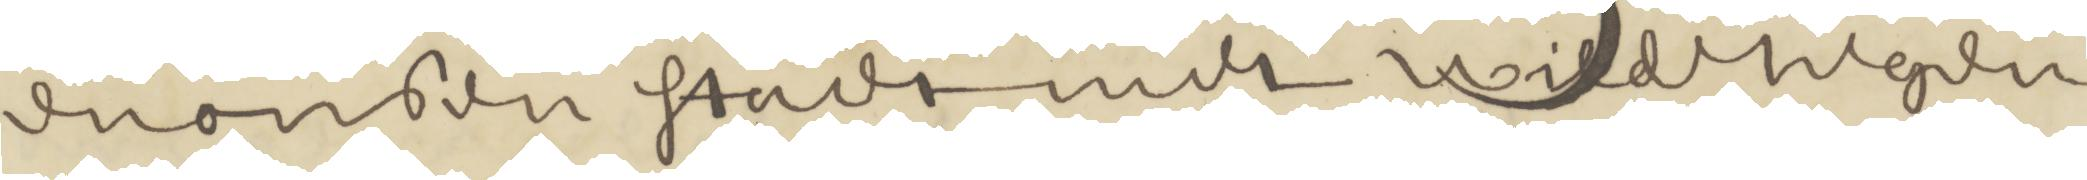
en onsen staet niet wilde tegen
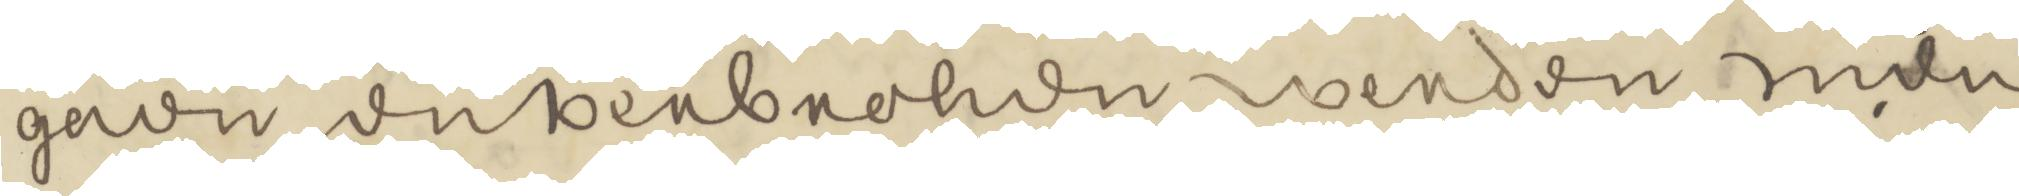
gaen en verbroken werden men
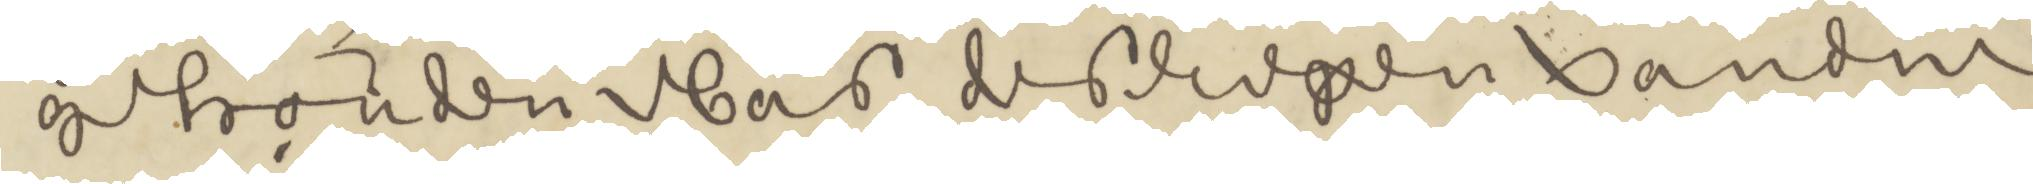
gehouden was de schepen van die
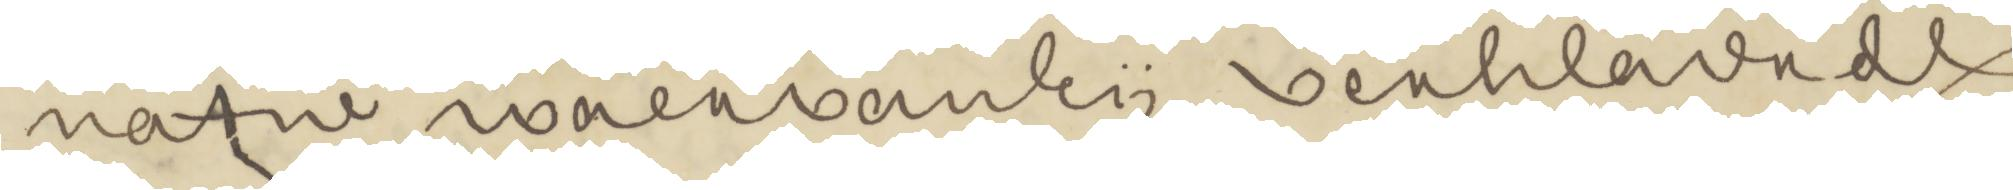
natie waer van hij verklaerde
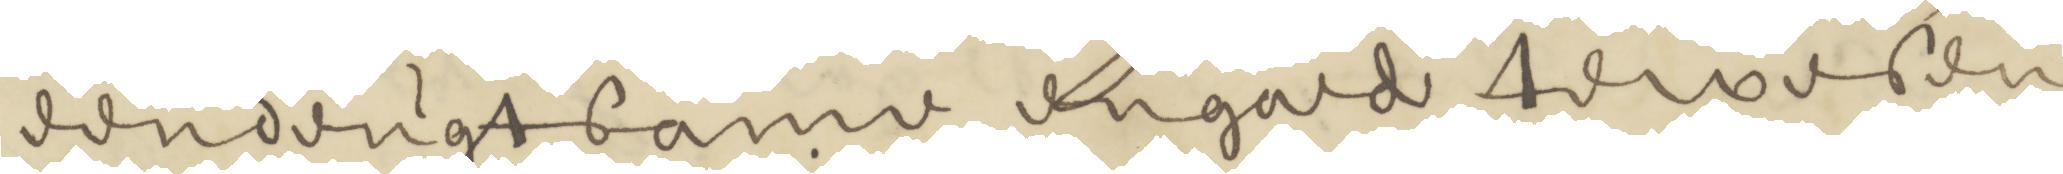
een deugtsame en goede te wesen
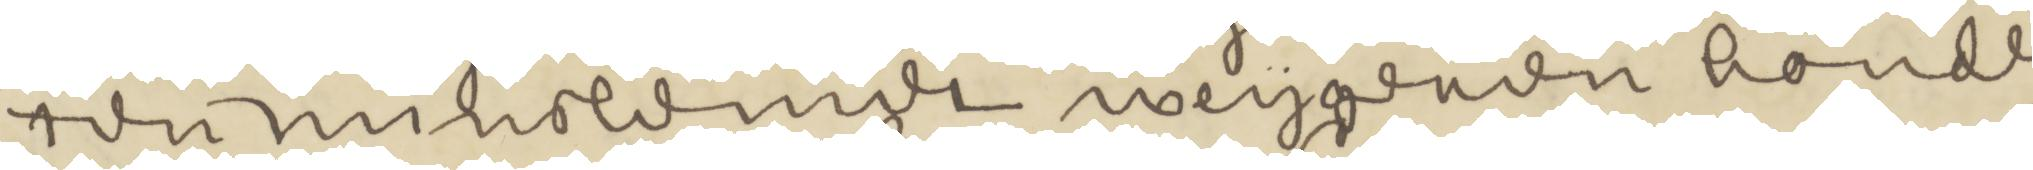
ten minste niet weijgeren konde
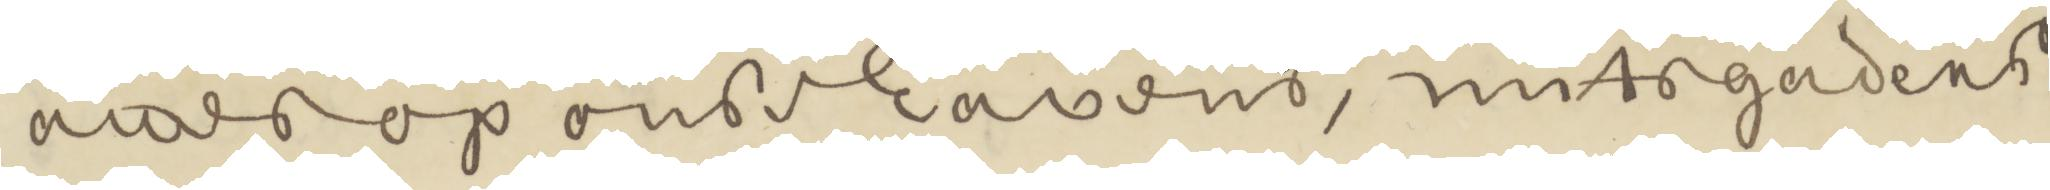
anes op onse havens, mitsgaders
